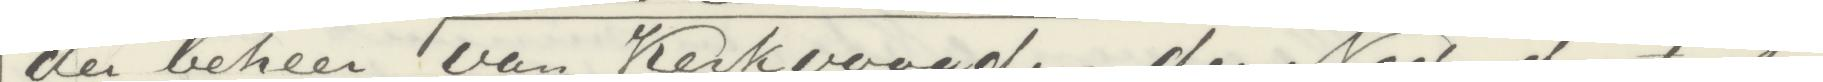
der beheer van Kerkvoogden der Nederduitsch
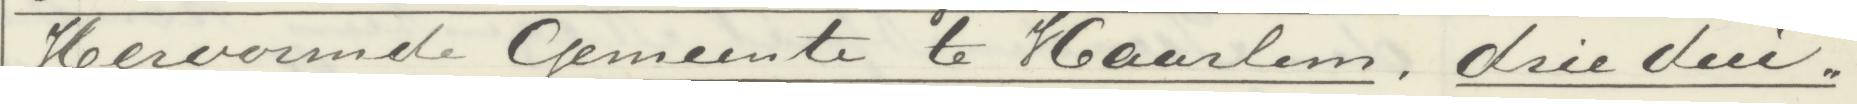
Hervormde Gemeente te Haarlem, drie dui„
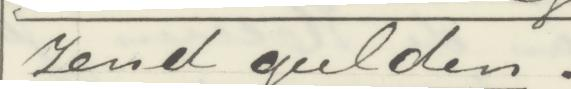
zend gulden.
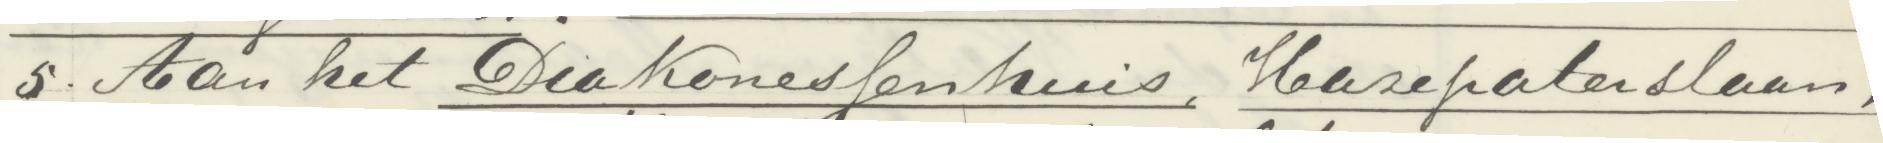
5. Aan het Diakonessenhuis, Hazepaterslaan,
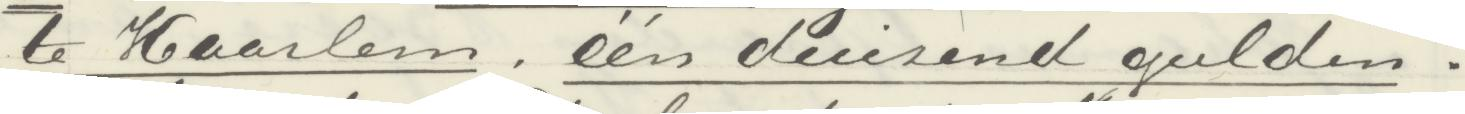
te Haarlem, één duizend gulden.
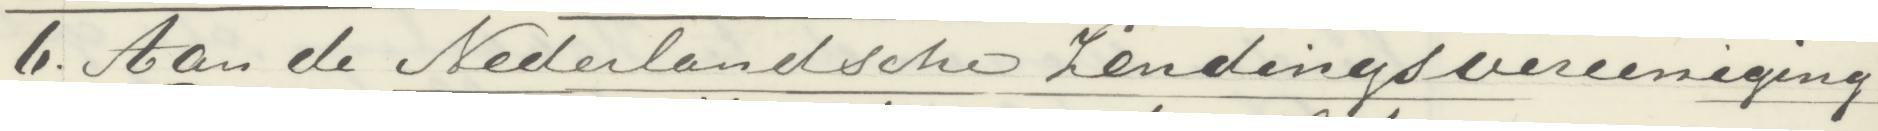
6. Aan de Nederlandsche Zendingsvereeniging
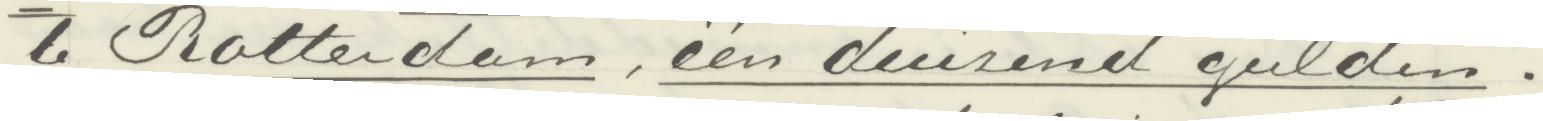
te Rotterdam, één duizend gulden.
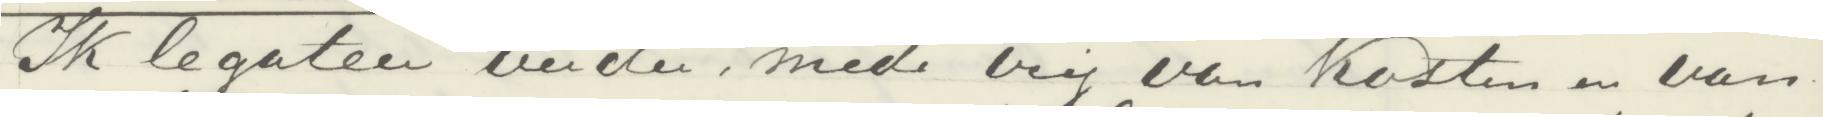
Ik legateer verder, mede vrij van kosten en van
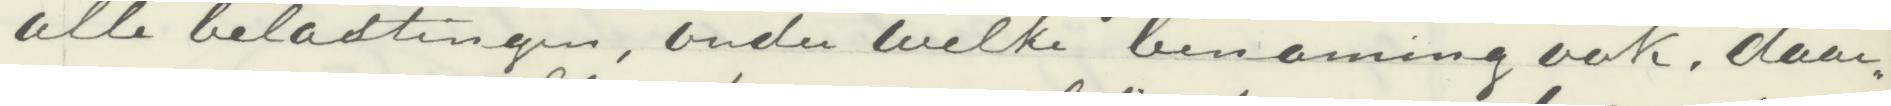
alle belastingen, onder welke benaming ook, daar„
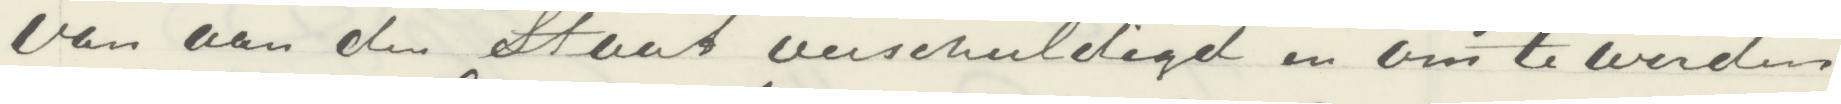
van aan den staat verschuldigd en om te worden
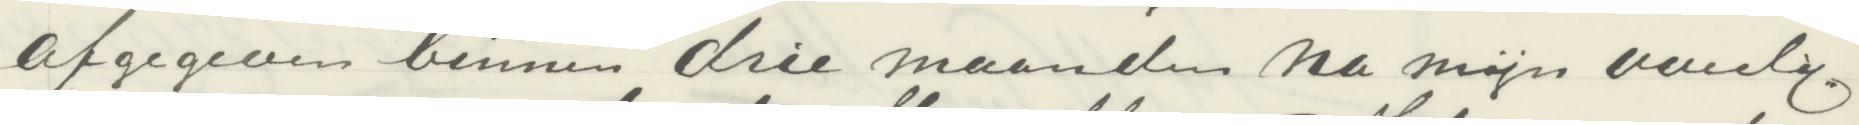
afgegeven binnen drie maanden na mijn overlij„
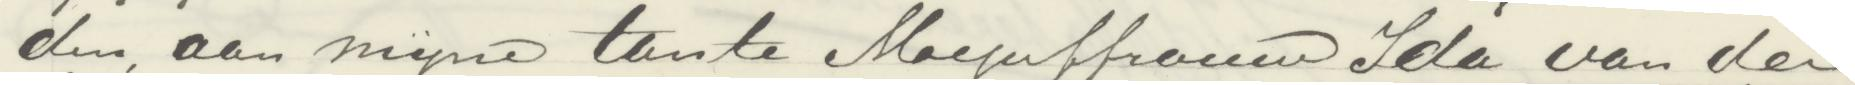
den, aan mijne tante Mejuffrouw Ida van der
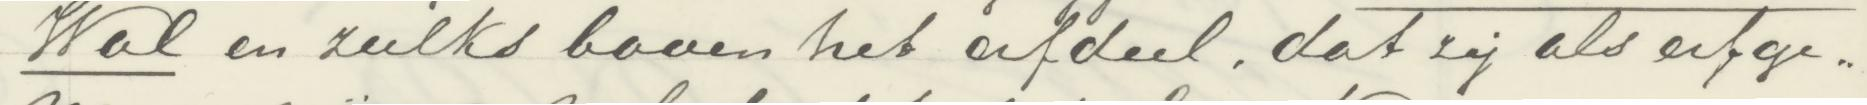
Wal en zulks boven het erfdeel, dat zij als erfge„
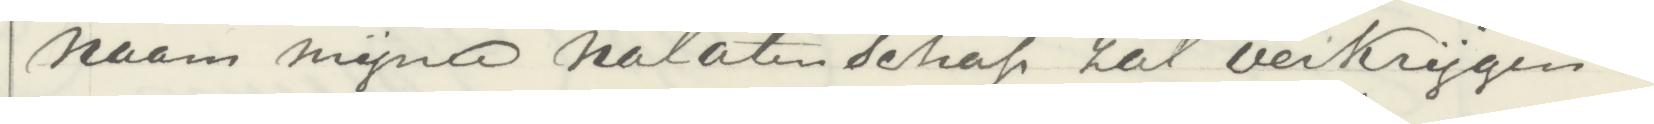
naam mijner nalatenschap zal verkrijgen:
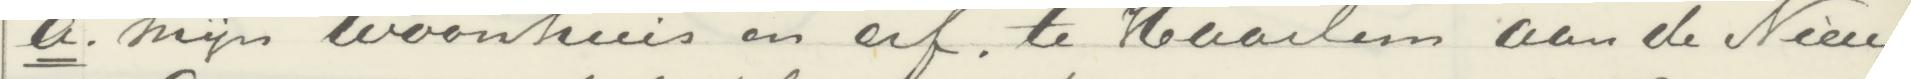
a. mijn woonhuis en erf, te Haarlem aan de Nieu
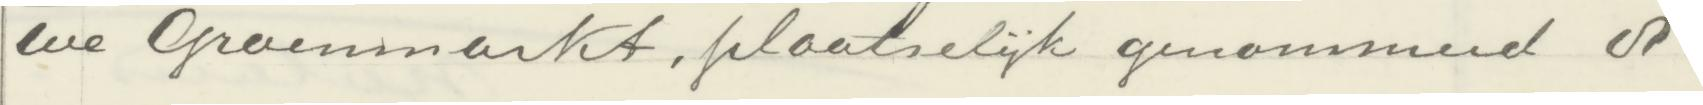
we Groenmarkt, plaatselijk genommerd 8
